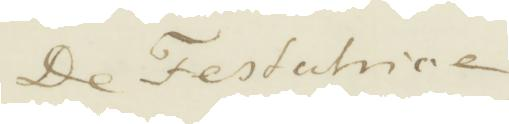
De Testatrice
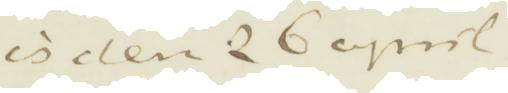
is den 26 april
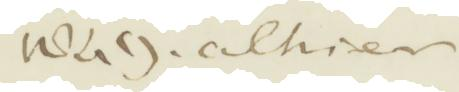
1849. alhier
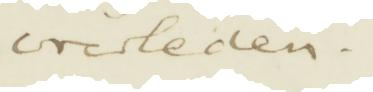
overleden.
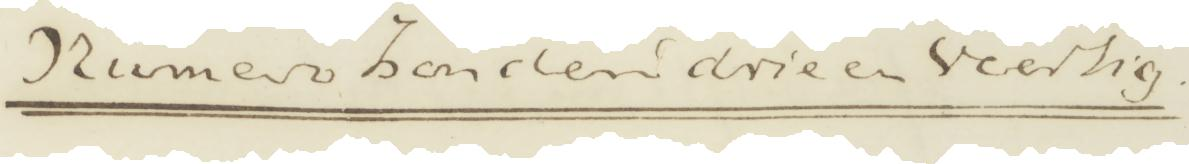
Numero honderd drie en Veertig
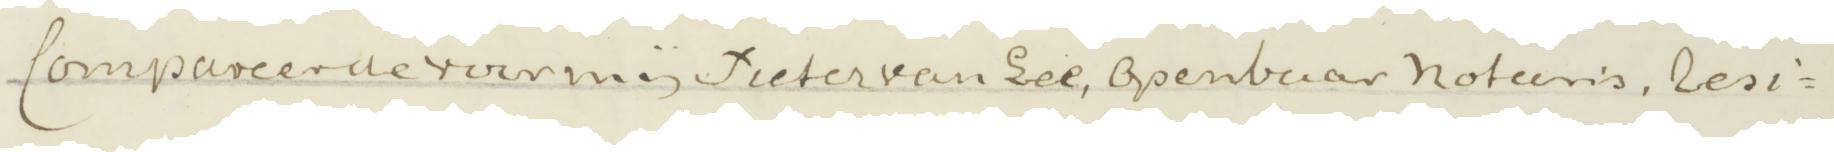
Compareerde voor mij Pieter van Lee, Openbaar Notaris, resi=
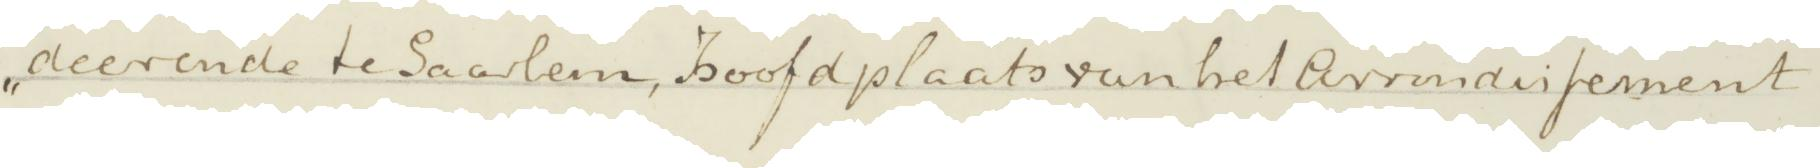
„deerende te haarlem, Hoofdplaats van het arrondissement
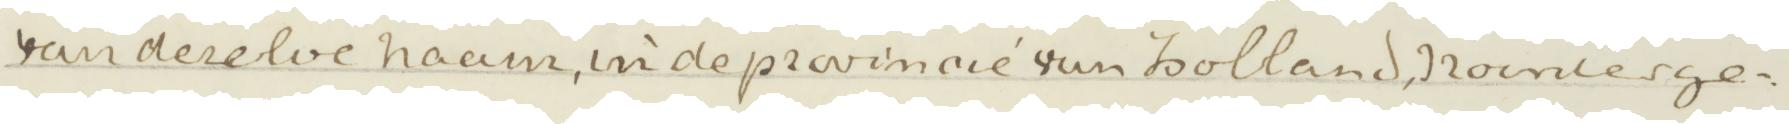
van dezelve naam, in de provincie van Holland, noorder ge=
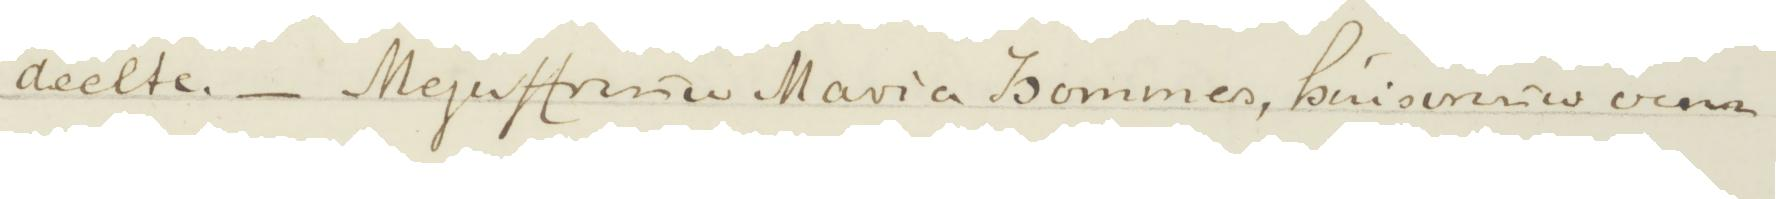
deelte. - Mejuffrouw Maria Hommes, huisvrouw van
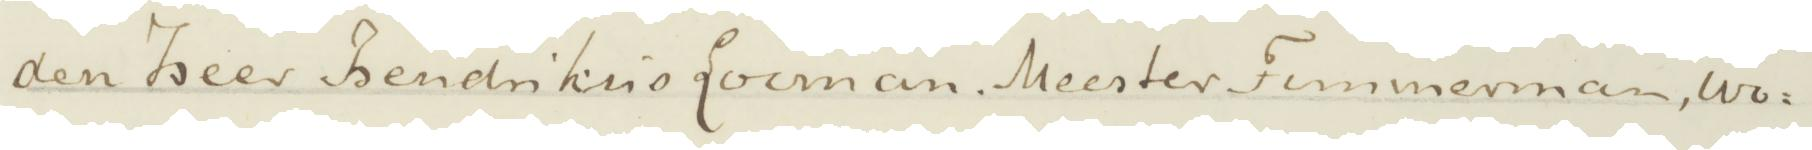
den Heer Hendrikus Looman, Meester Timmerman, wo=
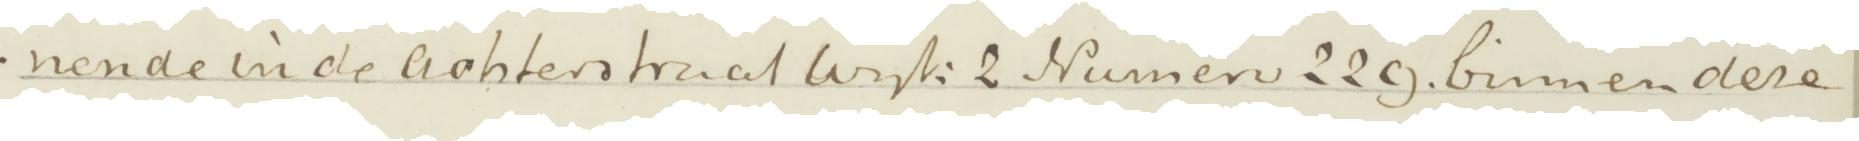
„nende inde achterstraat wyk 2 Numero 229, binnen deze
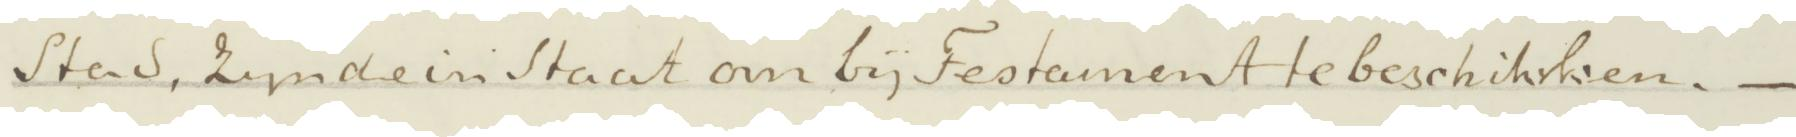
stad, Zynde in staat om bij Testament te beschikken.-
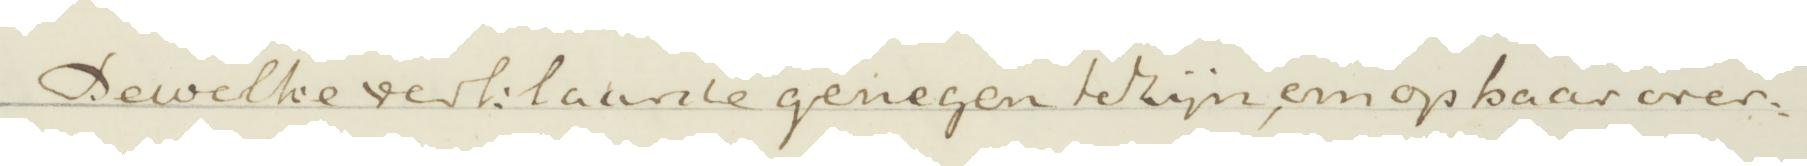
Dewelke verklaarde genegen te Zijn om op haar over„
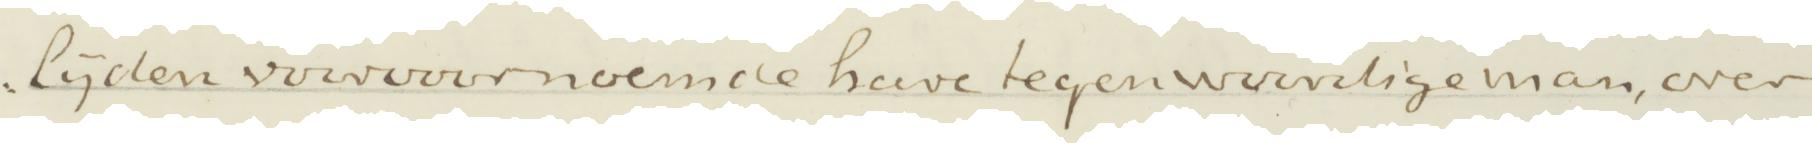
„lijden voor voornoemde hare tegenwoordige man, over
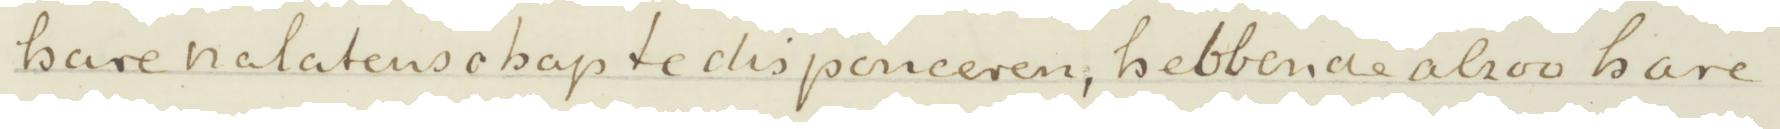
hare nalatenschap te disponeeren, hebbende alzoo hare
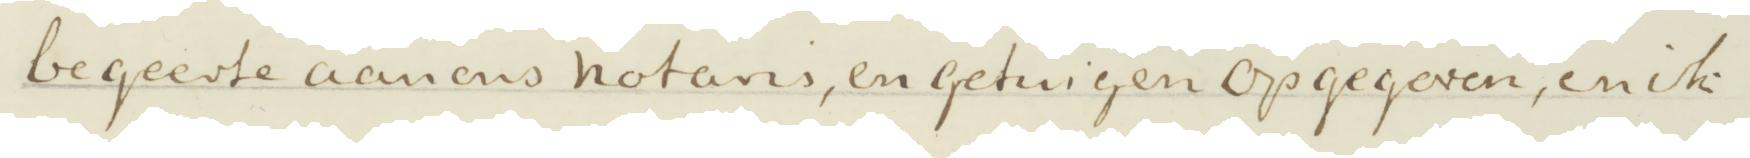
begeerte aan ons notaris, en getuigen opgegeven, en ik
